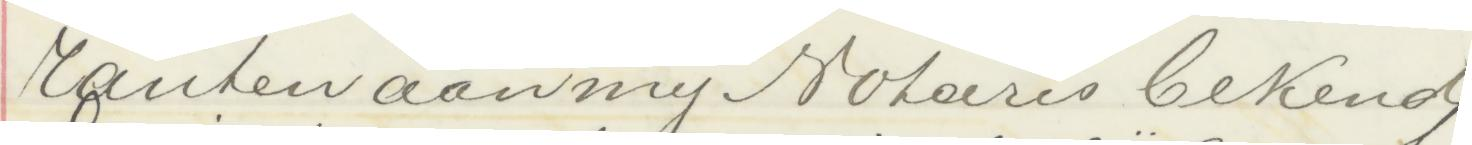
ranten aan mij Notaris bekend
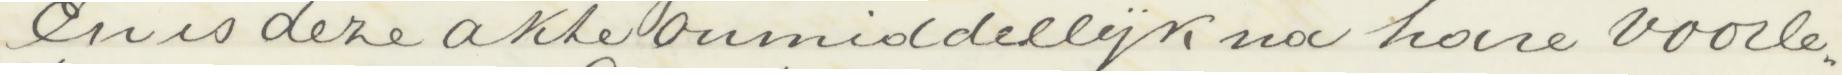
En is deze akte onmiddellijk na hare voorle„
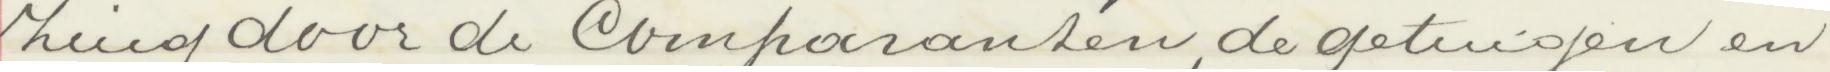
zing door de Comparanten, de getuigen en
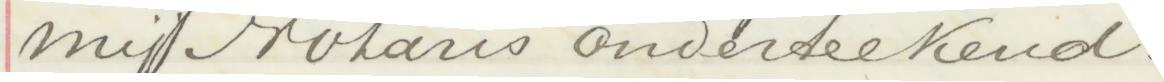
mij Notaris onderteekend.
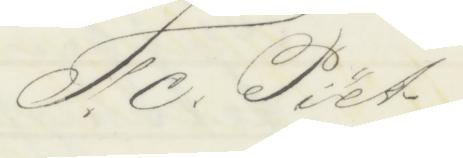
P: C. Piët
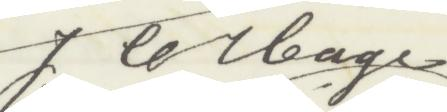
J vanbage
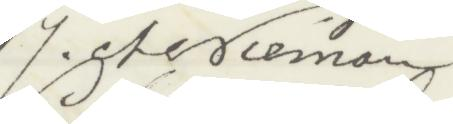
J.A Nieman
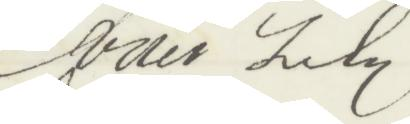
C vder Lely
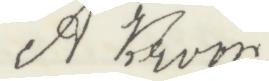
A Kroon
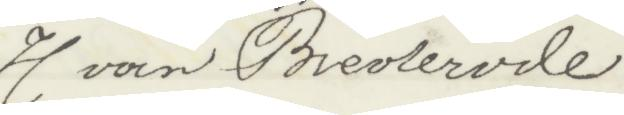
H van Brederode
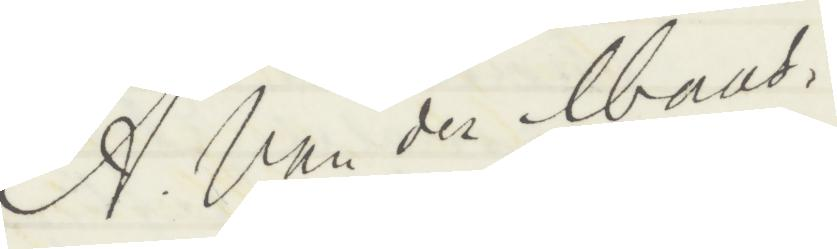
A: van der Maas
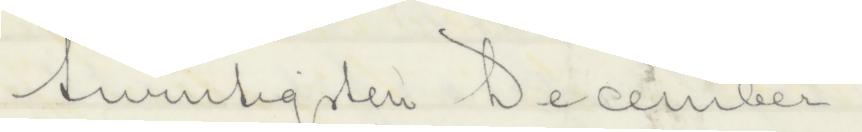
twintigsten December
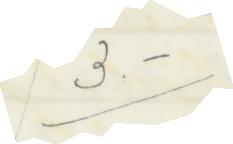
ƒ 3.-
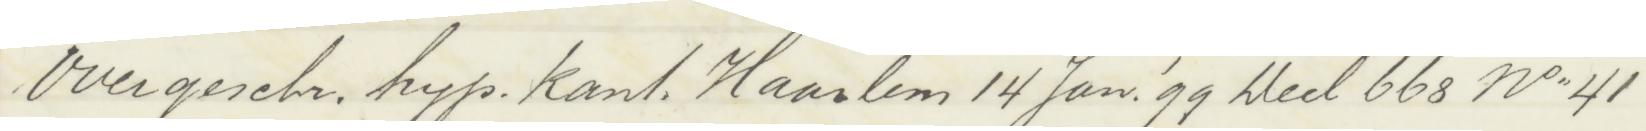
Overgeschr. hyp. kant Haarlem 14 Jan: '99 Deel 668 N„o 41
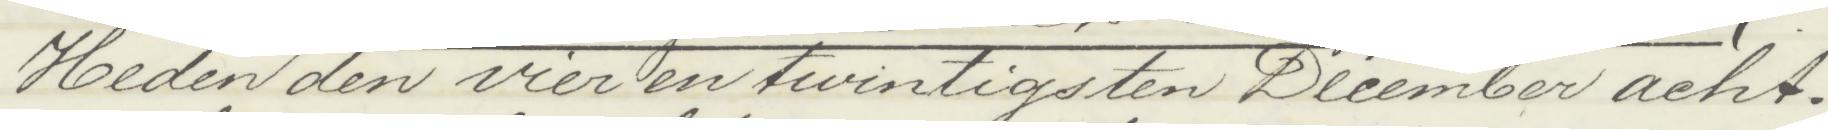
Heden den vier en twintigsten December acht-
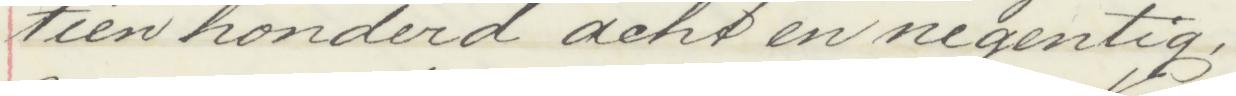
tien honderd acht en negentig,
